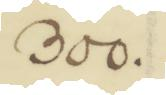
300.
